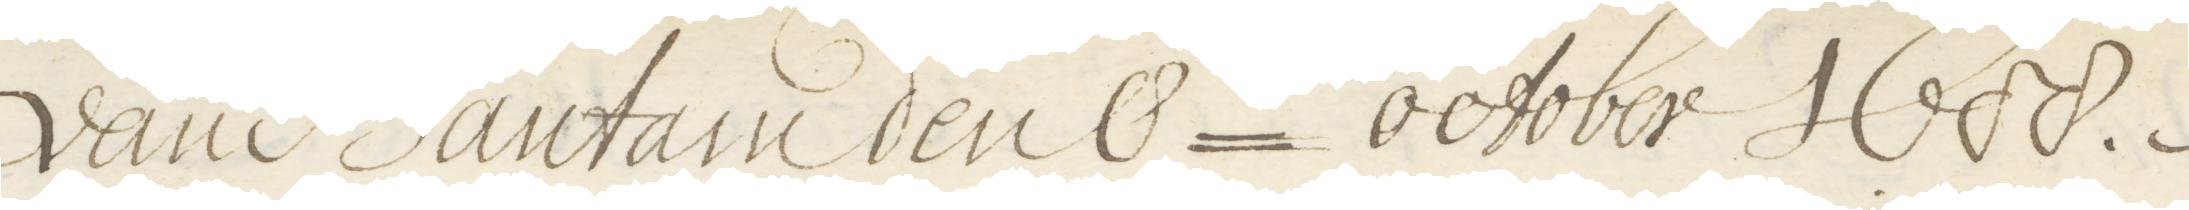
van Bantam den 8= october 1688. —
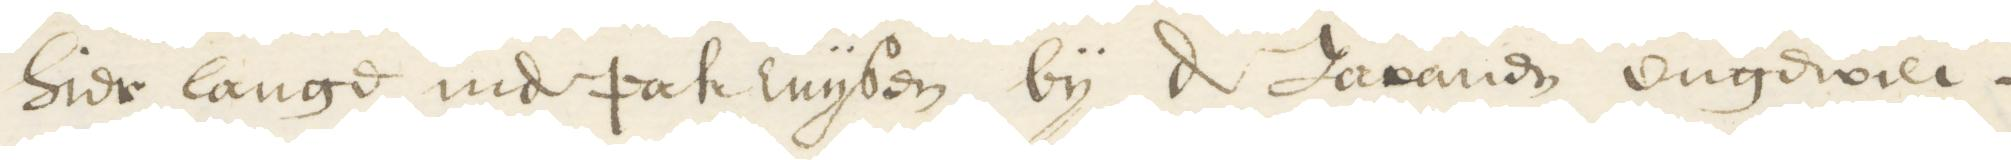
hier lange inde pakhuijsen bij de Javanen ongewilt
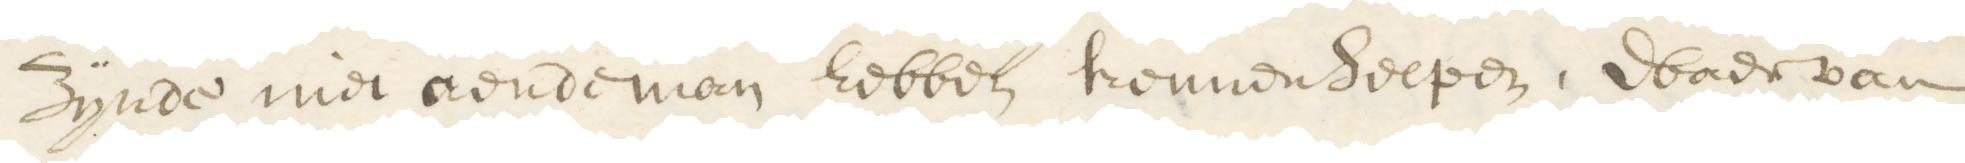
zijnde niet aen de man hebben konnen helpen, waervan
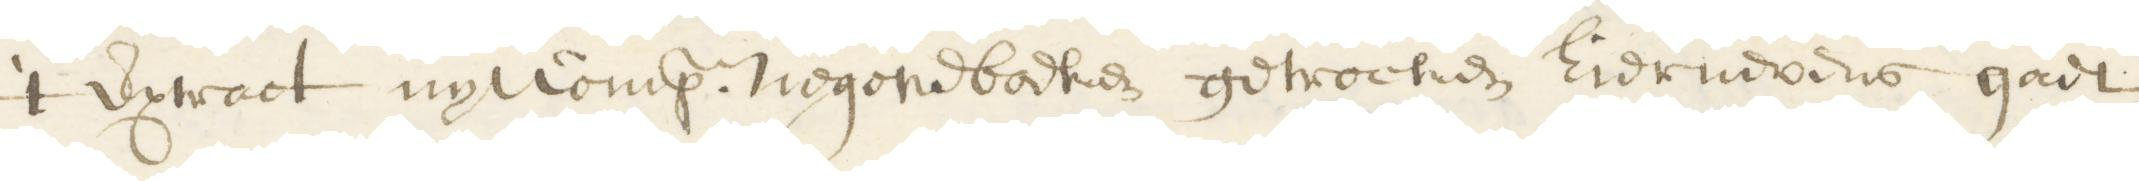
’t Extract uijt Comp: Negotieboeken getrocken hier nevens gaet,
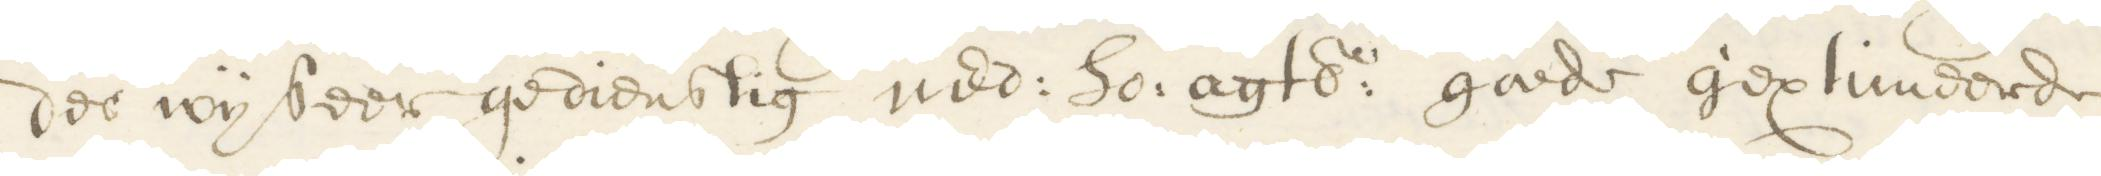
des wij seer gedienstig uEd: ho: agtb:e gaede g'extimeerde
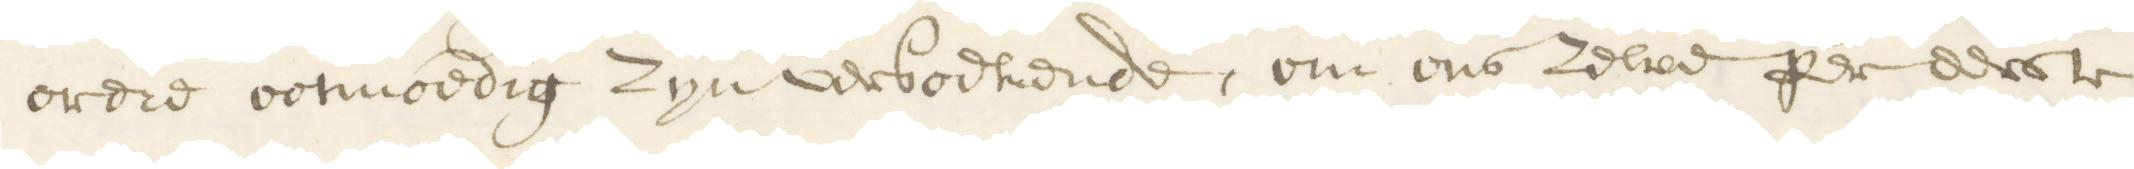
ordre ootmoedig zijn versoekende, om ons zelve per eerste
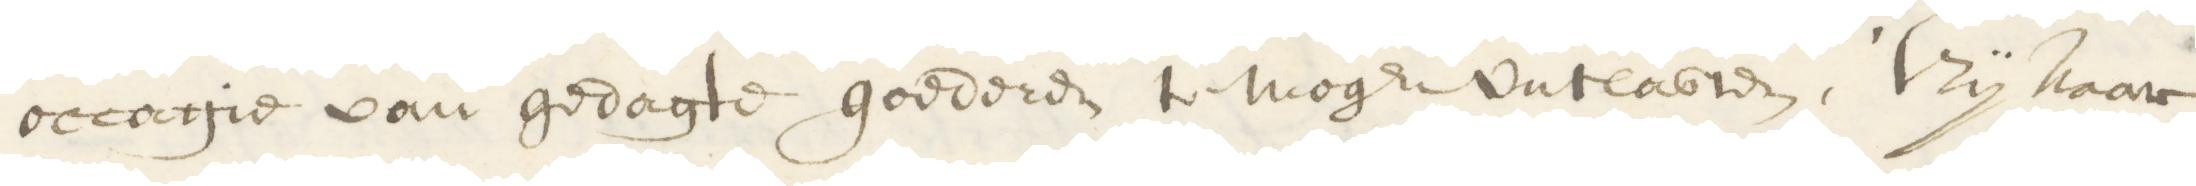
occagie van gedagte goederen te mogen ontlasten, ’t zij naar
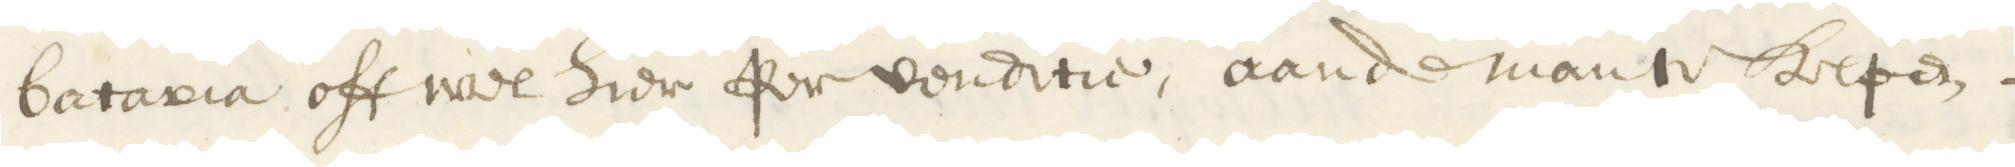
batavia oft wel hier per venditie, aan de man te helpen
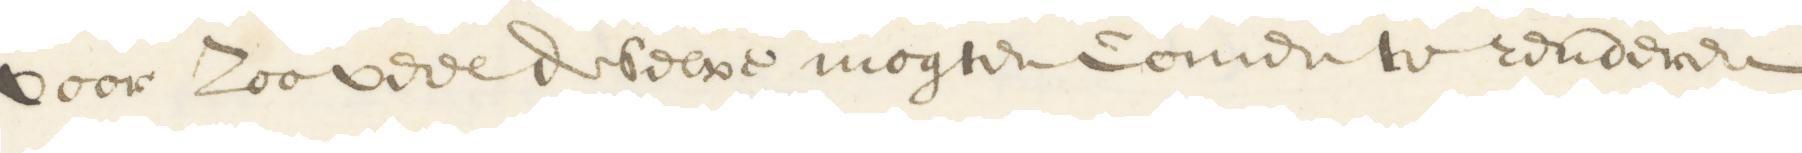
voor zoo veel deselve mogten comen te renderen
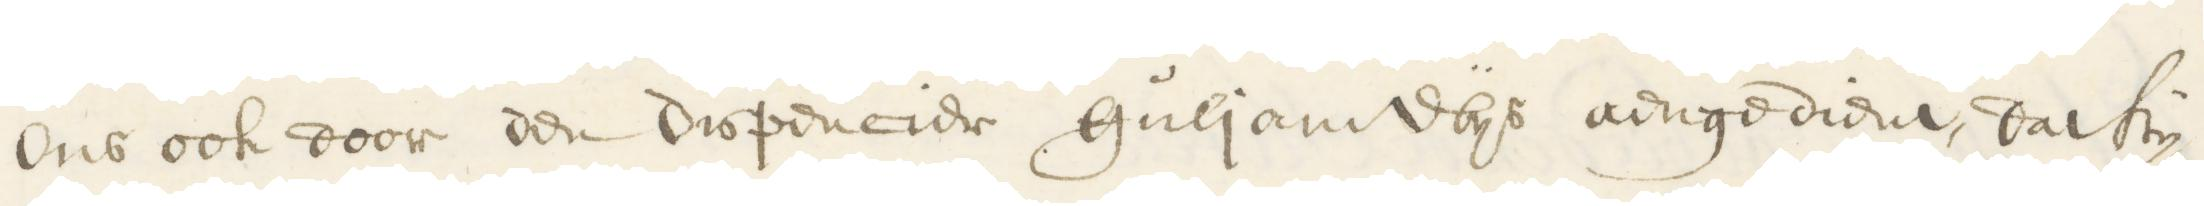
Ons ook door den dispencier Guljam Wijs aengedient, dat hij
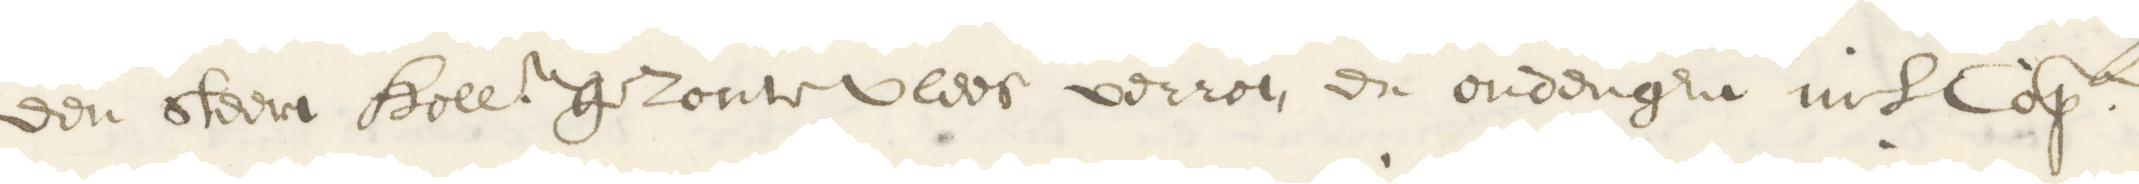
een steert Holl.ts gezoute vlees verrot, en ondeughe ins Cop:
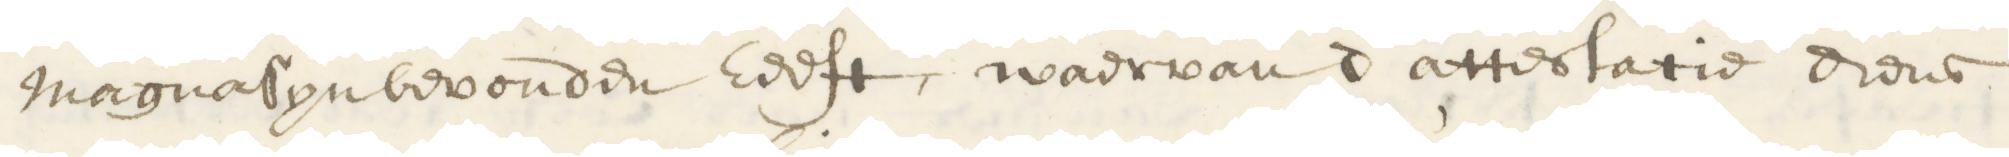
maguasijn bevonden heeft, waervan d' attestatie diens
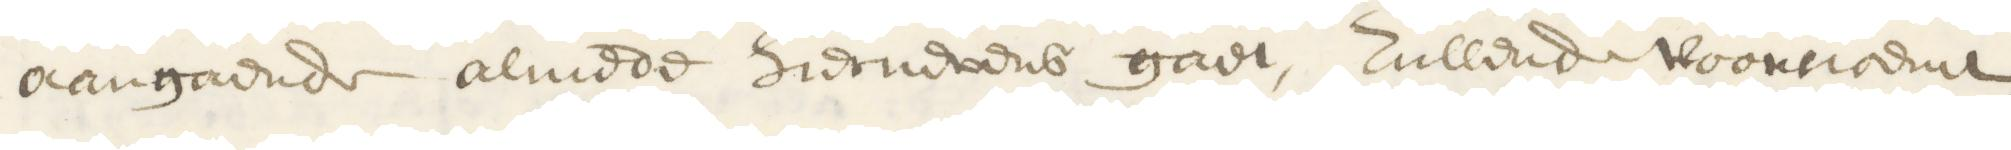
aangaende almede hiernevens gaet, zullende voornoemt
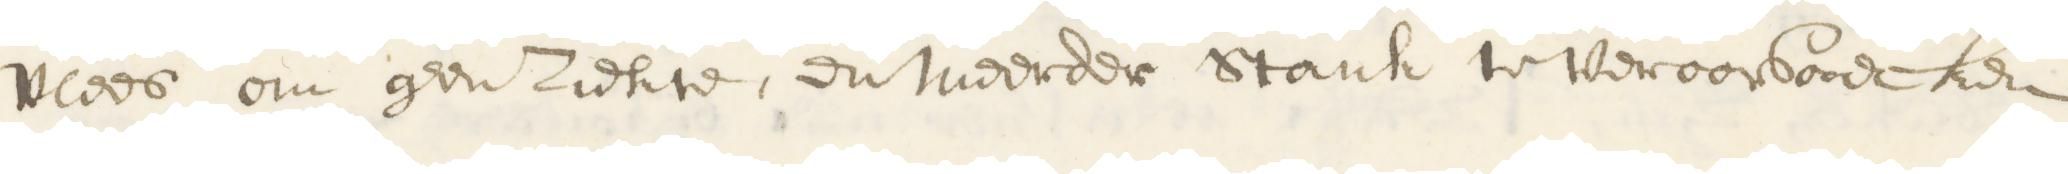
vlees om geen ziekte, en meerder stank te veroorsaecken
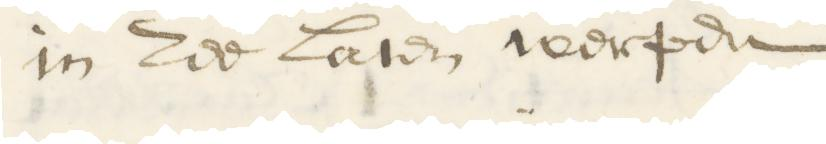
in zee laten werpen
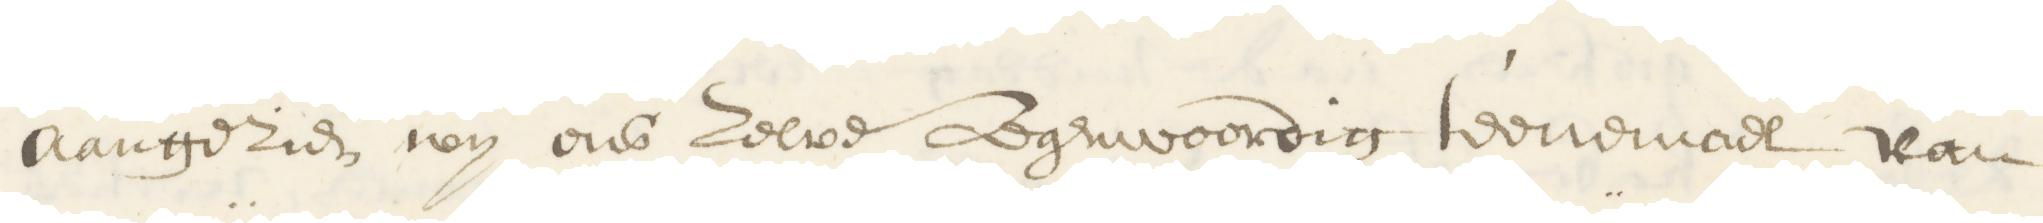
aangezien wij ons zelve Tegenwoordig te'enemael van
